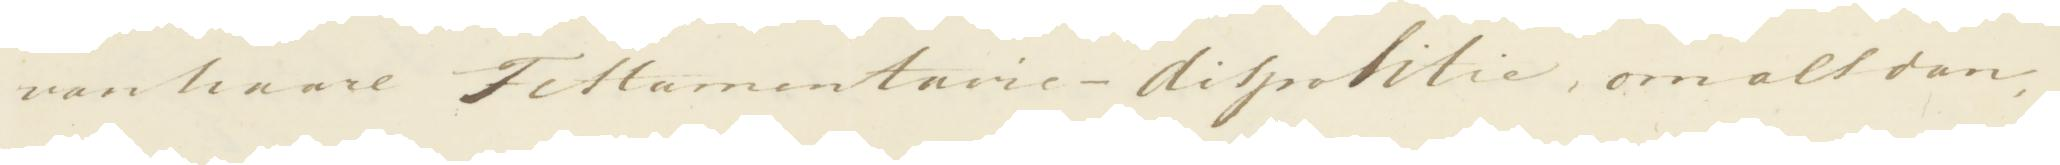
van haare Testamentarie - dispositie, om als dan,
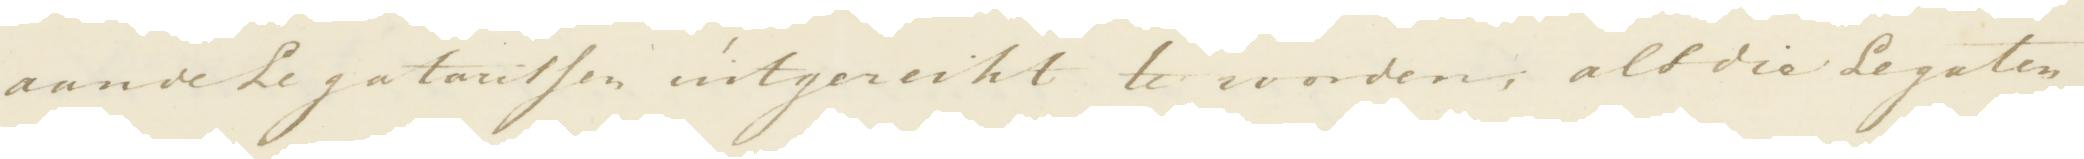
aan de Legatarissen uitgereikt te worden, als die Legaten
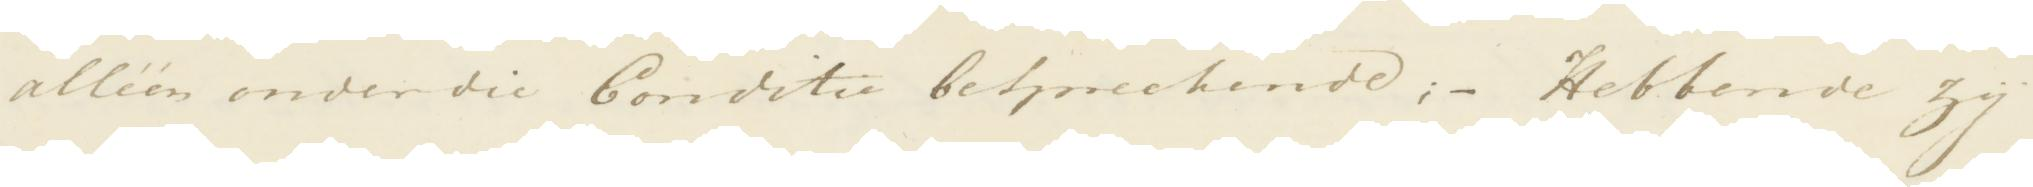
alléén onder die Conditie bespreekende; - Hebbende zij
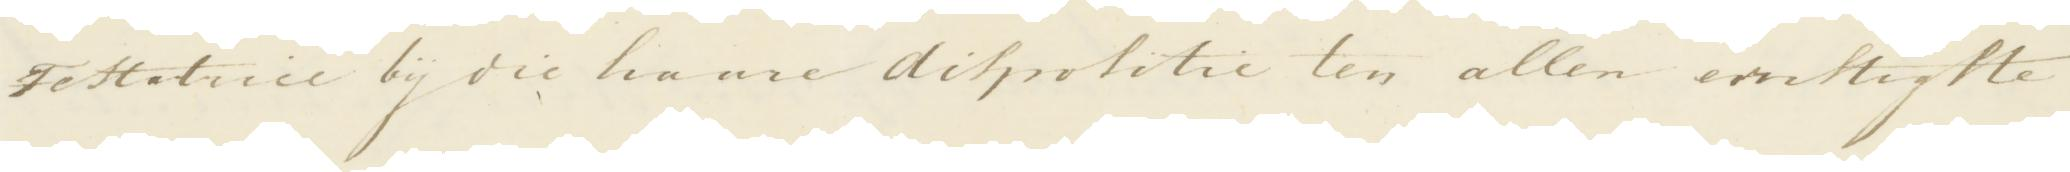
Testatrice bij die haare dispositie ten allen ernstigste
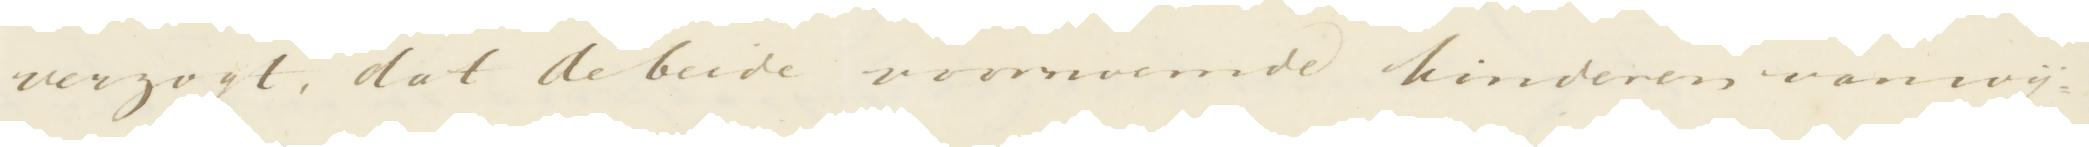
verzogt, dat de beide voornoemde kinderen van wij=
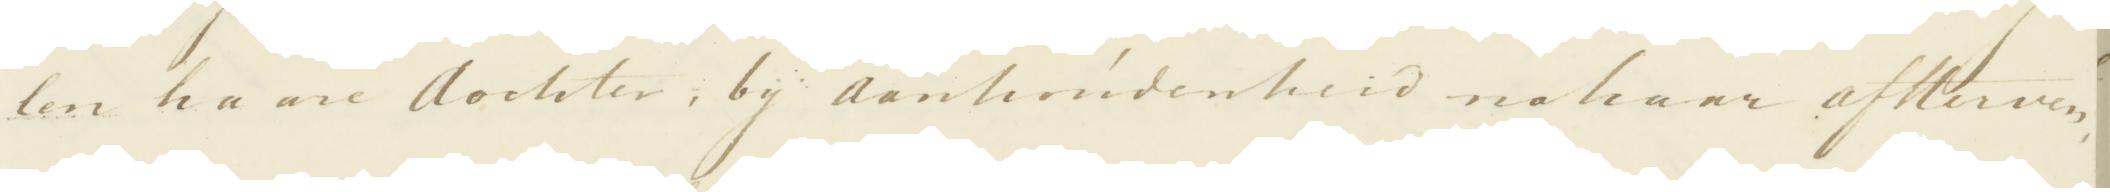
len haare dochter, bij aanhoudenheid na haar afsterven,
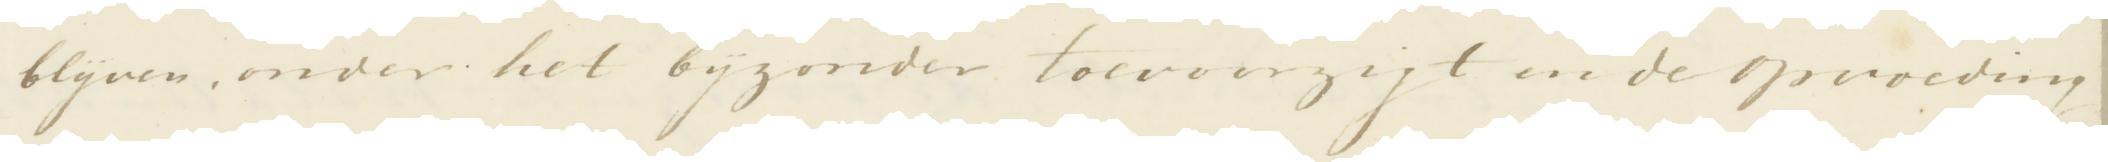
blijven, onder het bijzonder toevoorzigt en de opvoeding
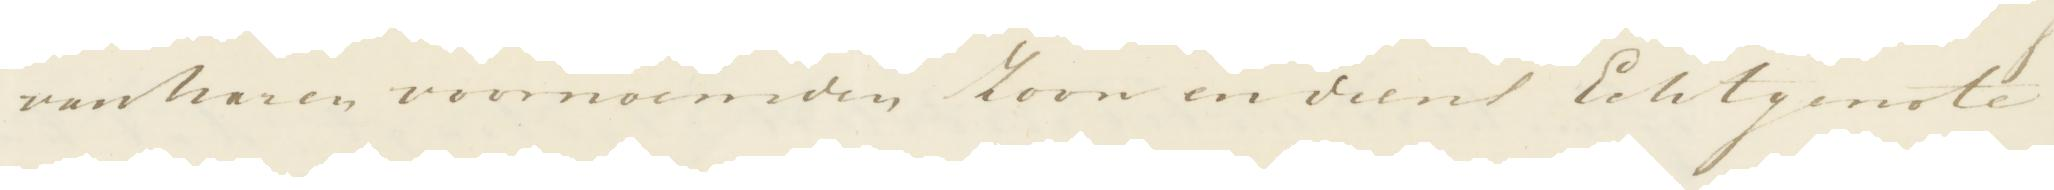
van haren voornoemden Zoon en diens Echtgenote
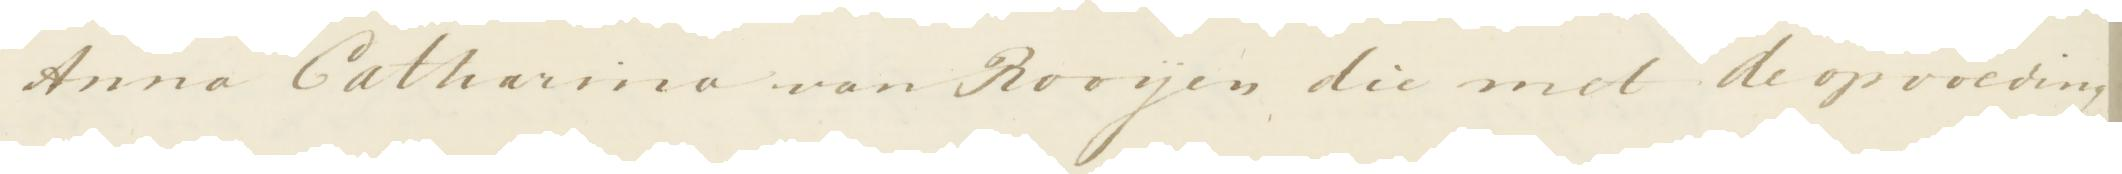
Anna Catharina van Rooijen die met de opvoeding
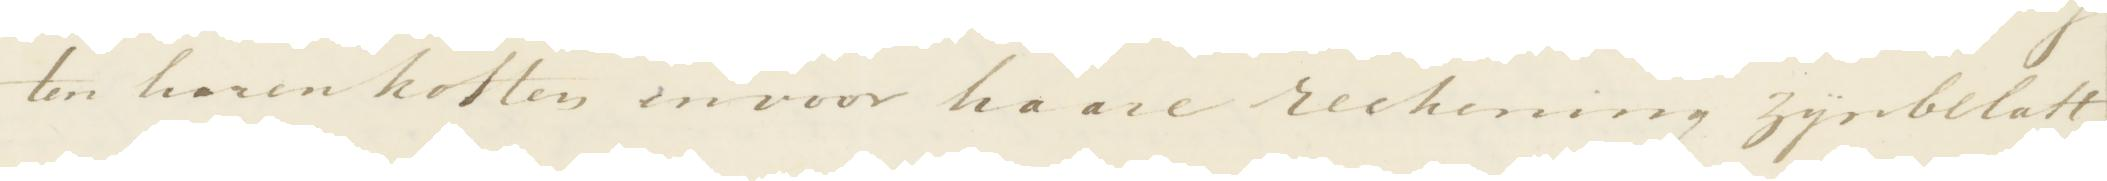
ten haren kosten en voor haare reekening zijn belast
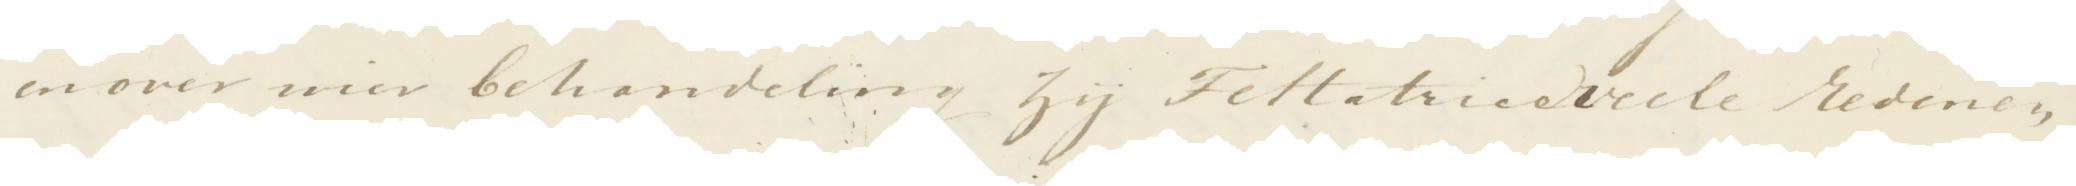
en over wier behandeling Zij Testatrice veele redenen
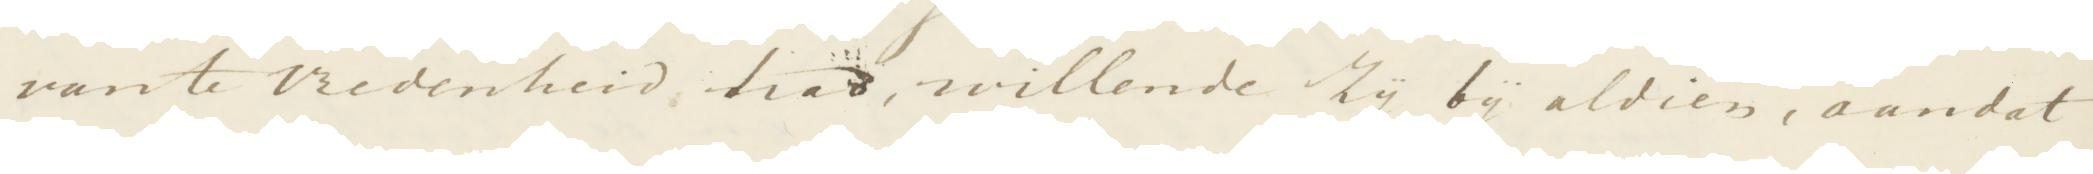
van te vredenheid had, willende Zij bij aldien, aan dat
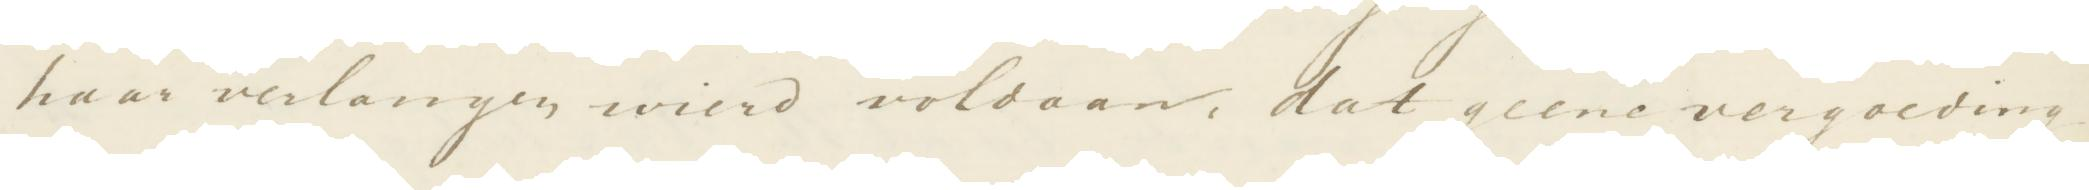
haar verlangen wierd voldaan, dat geene vergoeding
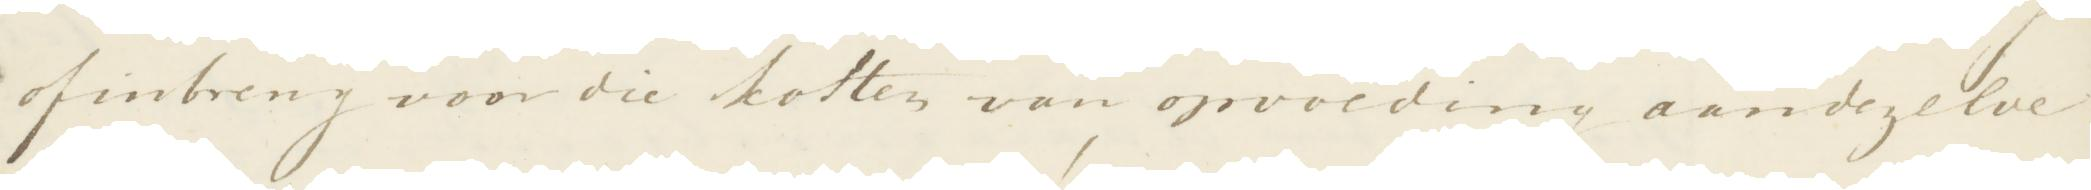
of inbreng voor die kosten van opvoeding aan dezelve
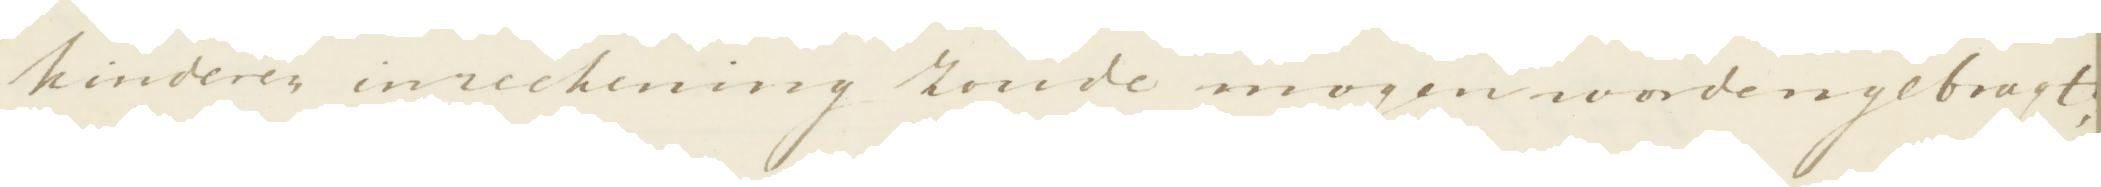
kinderen in reekening zoude mogen worden gebragt;
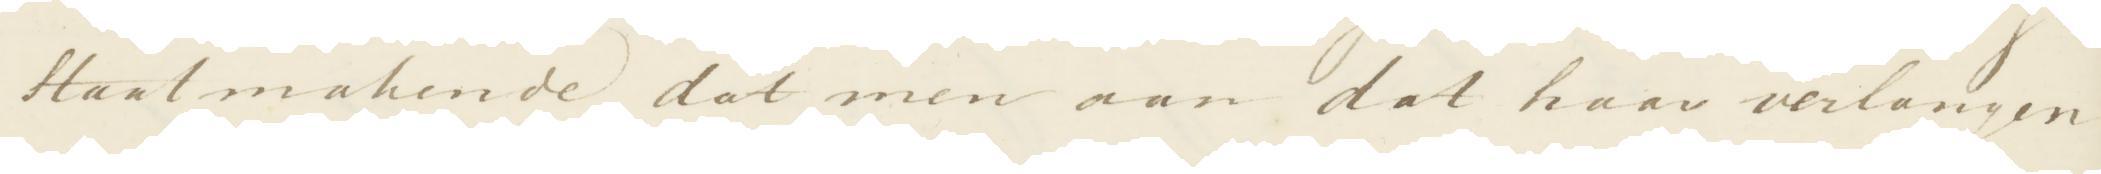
Staat, makende dat men aan dat haar verlangen
